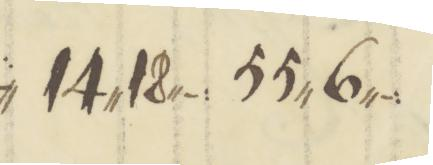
: „ 14„ 18„ - : 55„ 6„ - :
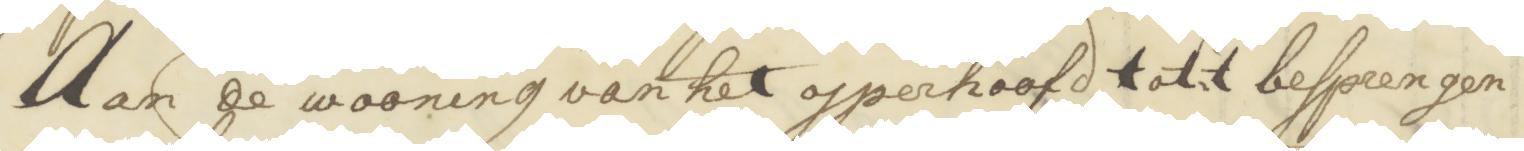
Aan de wooning van het opperhoofd tot „'t besprengen
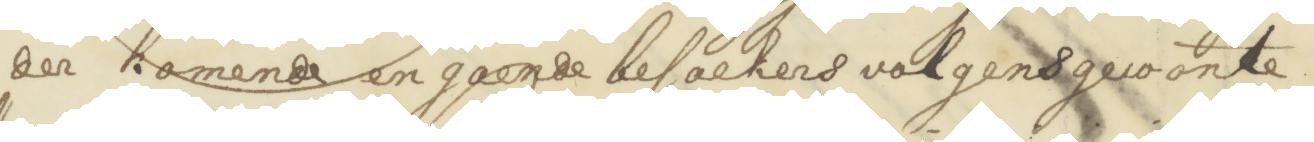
der komende en gaende besoekers volgens gewonte
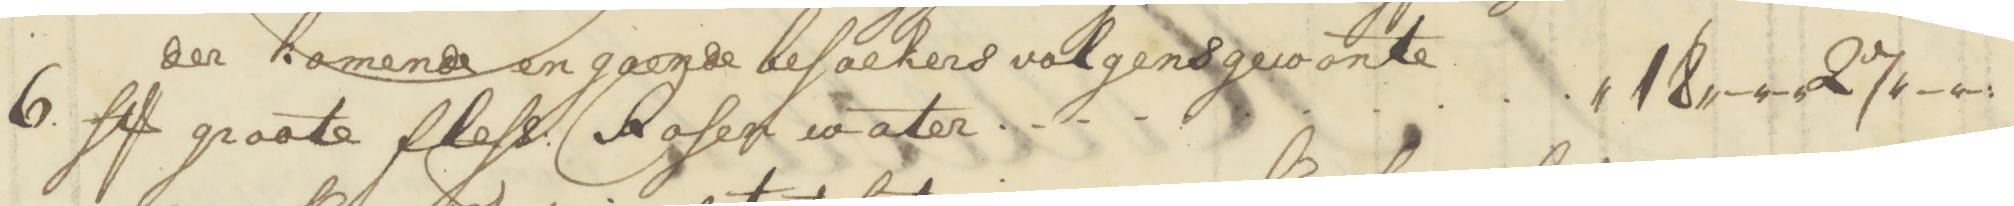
6. stver groote fless: Rosen water . - - - . . . . . . . „ 18„ —„ —„ 27„ —„ —:
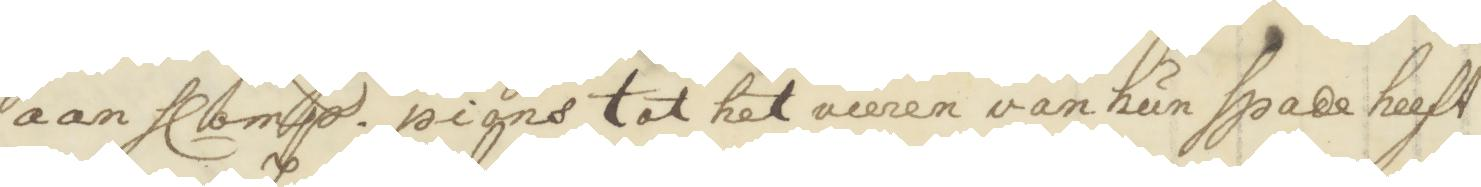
aan sComp. pions tot het vieren van hun spade heeft
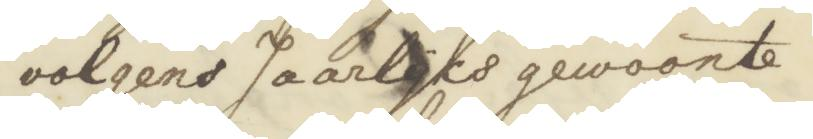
volgens Jaarlijks gewoonte
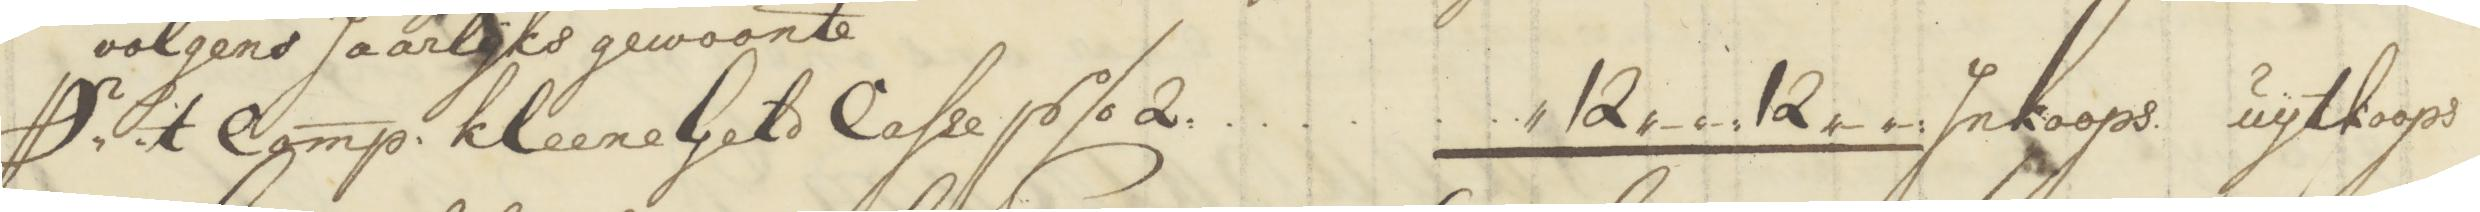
P„r „'t Comp. kleene Geld Casse pa/o 2: . . . . . . . „ 12„ —„ —„ 12„ —„ —: Jnkoops uijtkoops
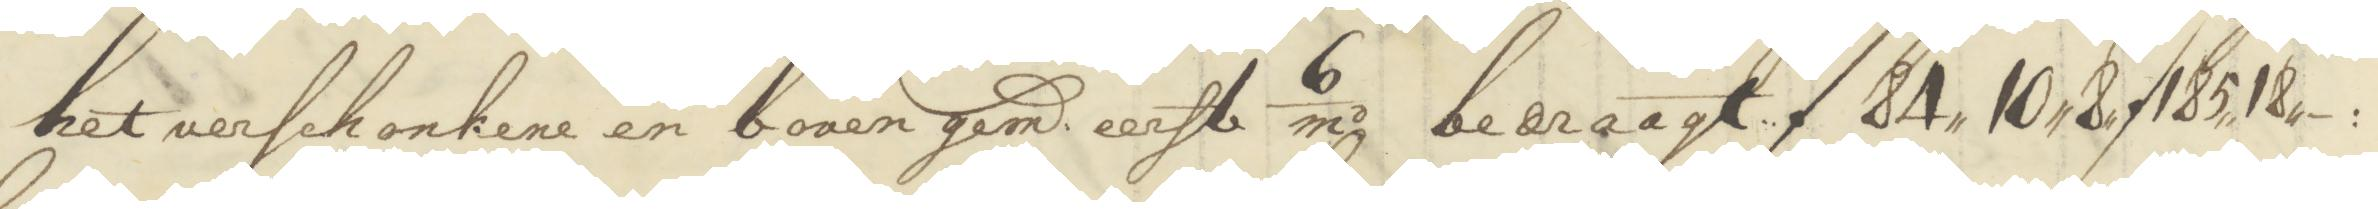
het verschonkene en boven gem: eerste 6/m„d bedraagt . . ƒ 84„ 10„ 8„ ƒ 185„ 18„ —:
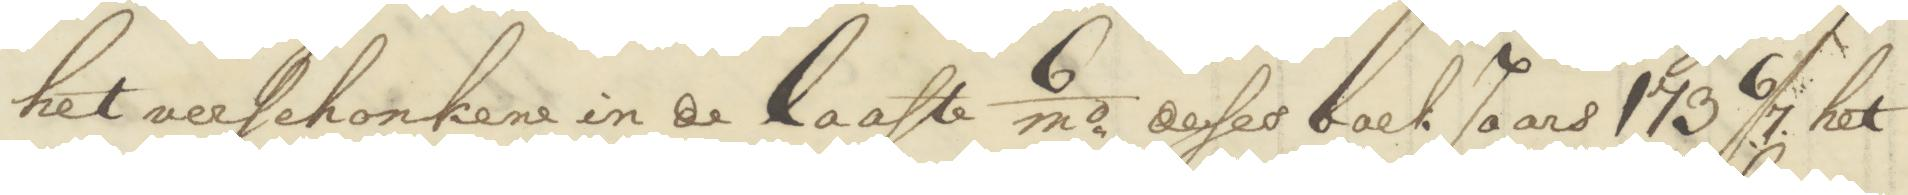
het verschonkene in de laaste 6/m„d deses boek Jaars 173 6/7. het
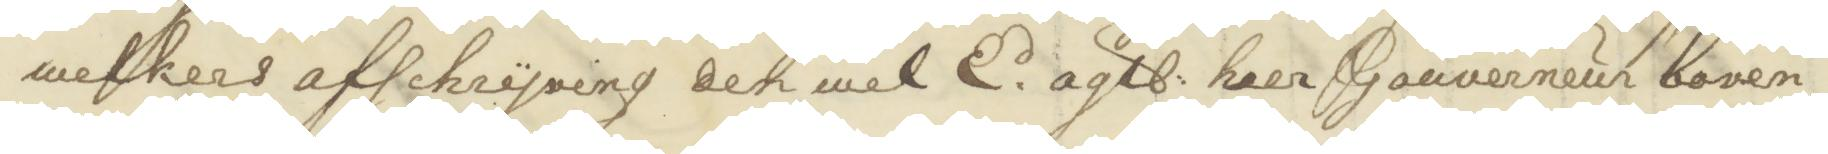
welkers afschrijving den wel E:d agtb: haer Gouverneur boven
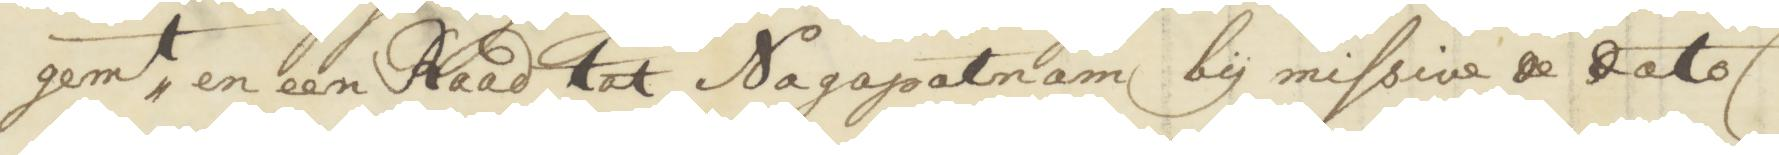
gem„t en een Raad tot Nagapatnam bij missive de dato
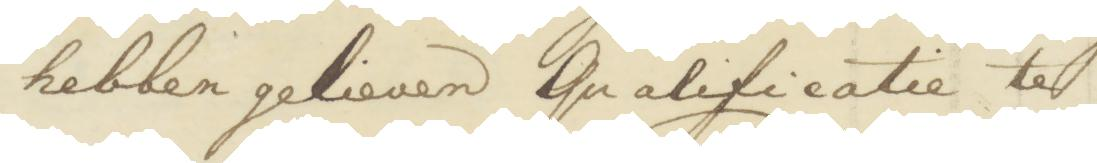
hebben gelieven qualificatie te
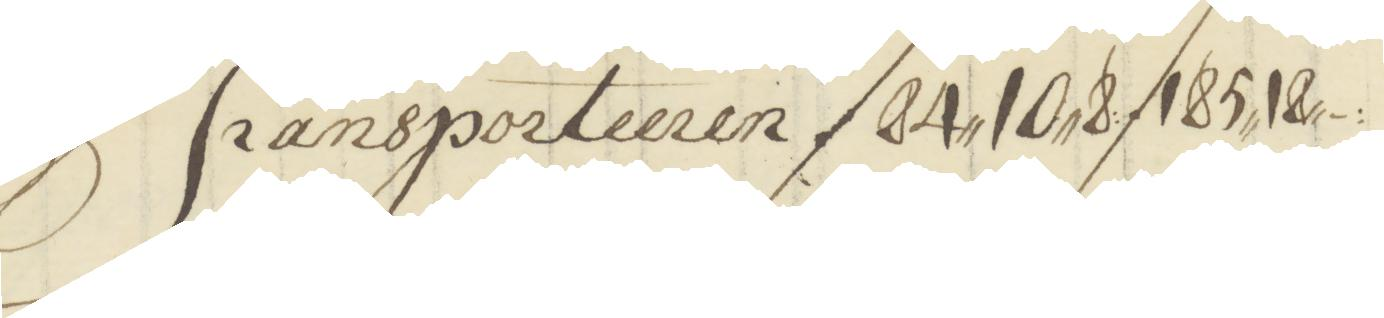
Transporteeren ƒ 84„ 10„ 8: ƒ 185„ 18„ —:
